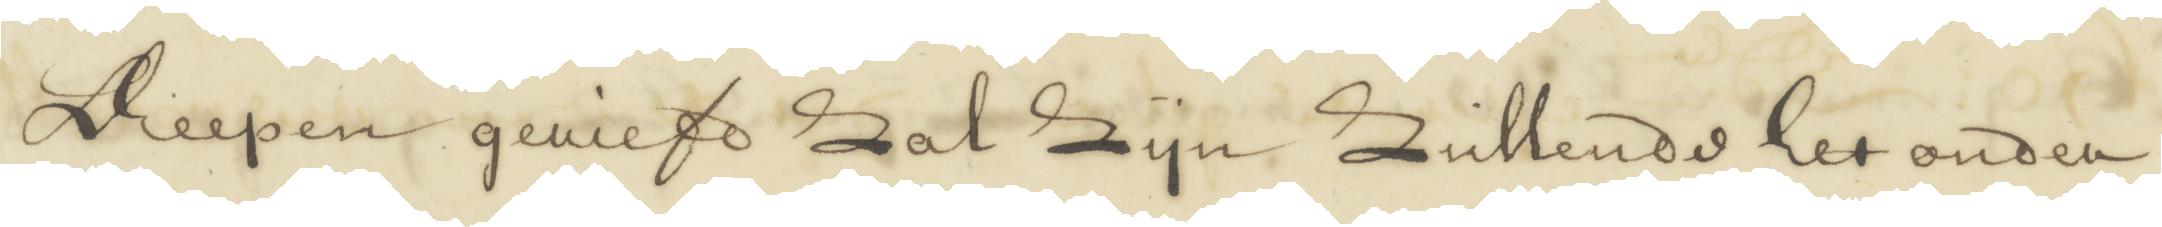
scheepen geriefd zal zijn zullende het onder
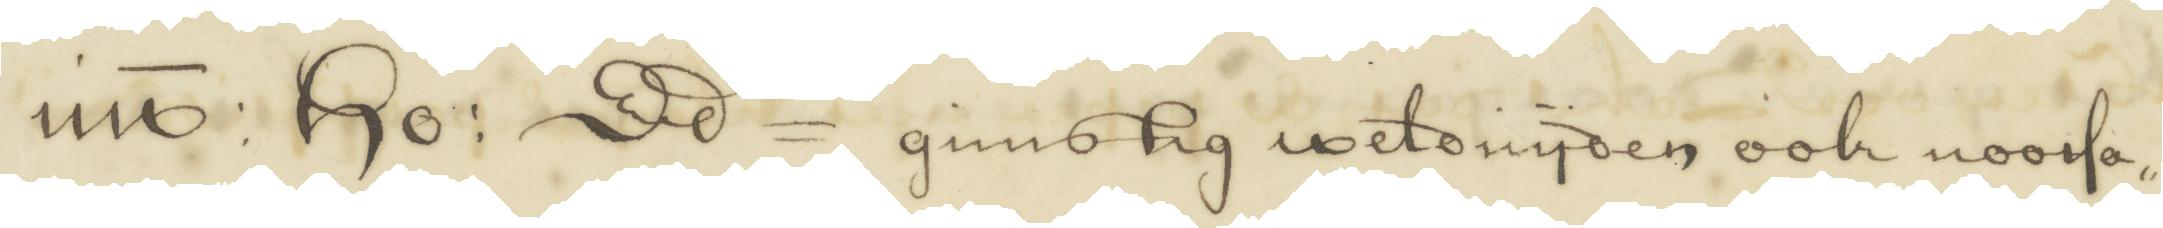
uw: Ho: Ed=lens gunstig welduijden ook nootsa„
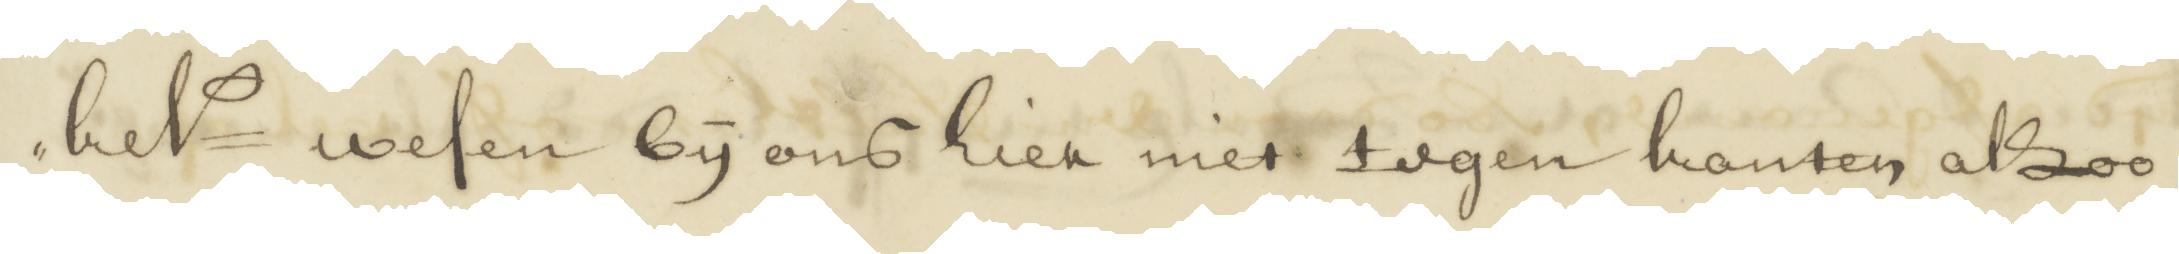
„kel=t wesen bij ons hier niet tegen kanten alzoo
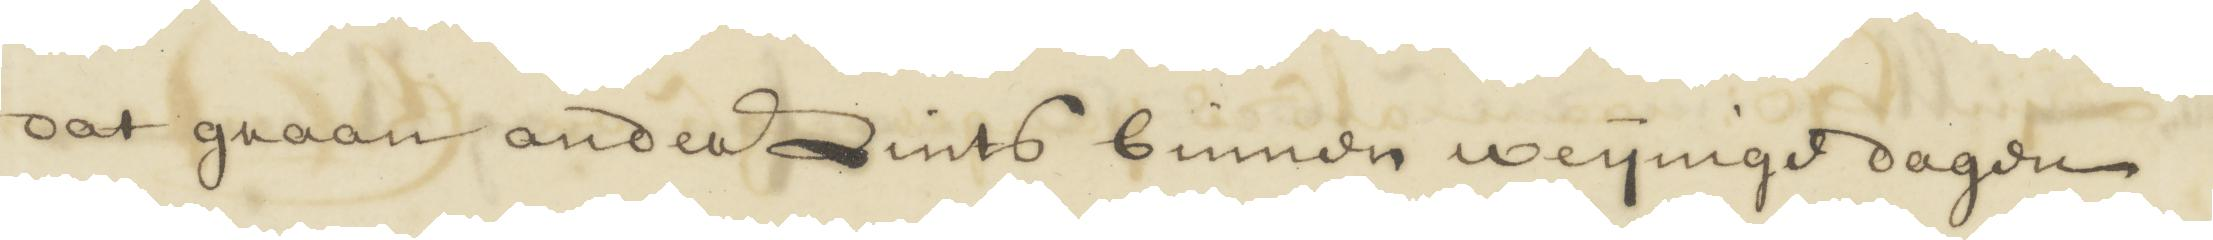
dat graan anderzints binnen weijnige dagen
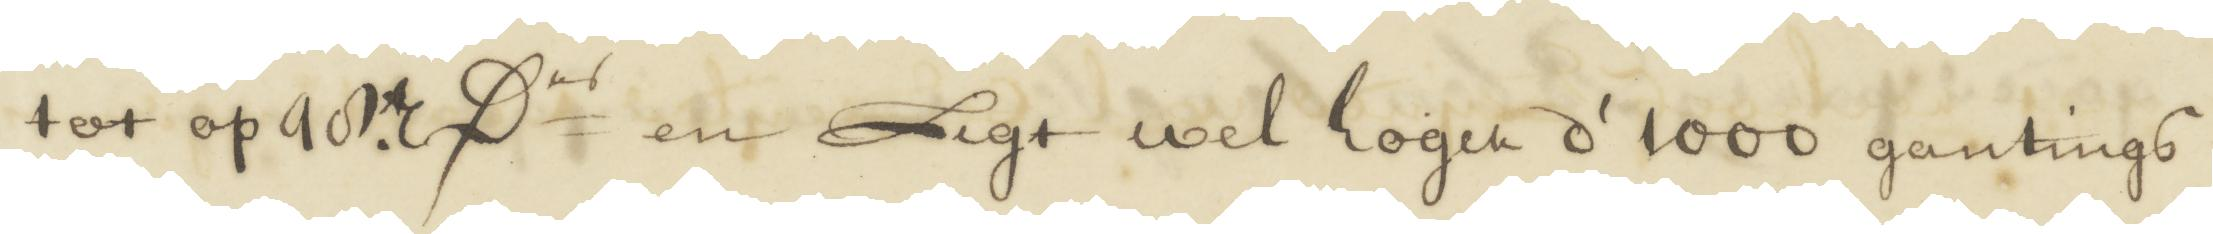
tot op 48. RD=rs en Ligt wel hoger d’ 1000 gantings
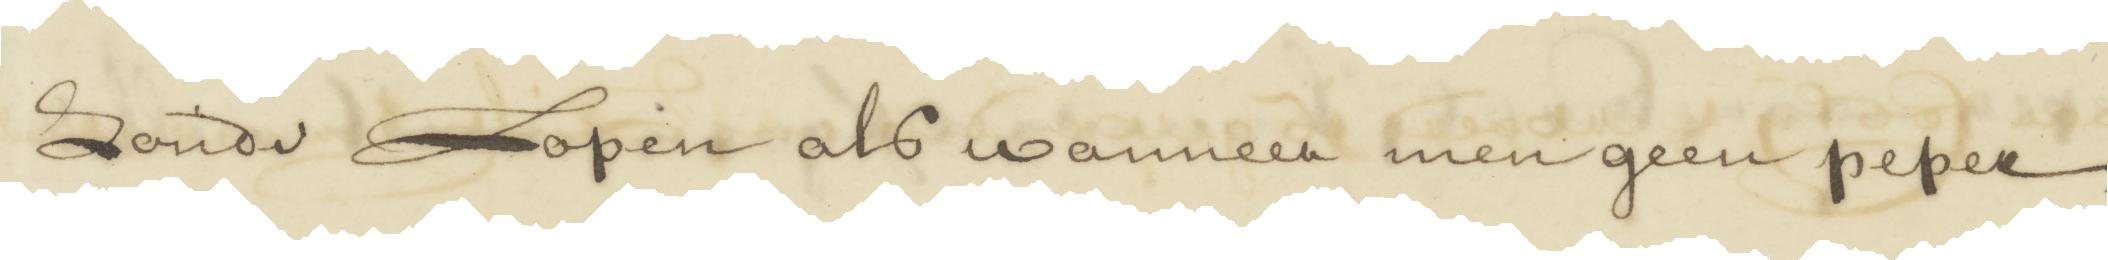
zoude Lopen als wanneer men geen peper
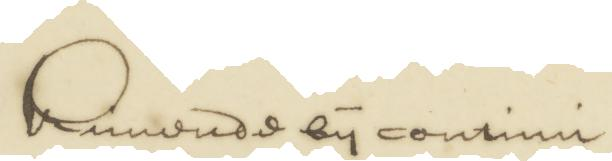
kunende bij continu
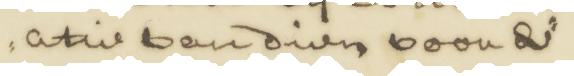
„atie van dien voor de
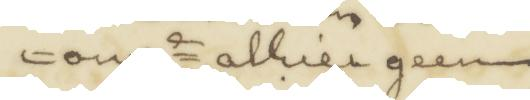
comp=e alhier geen
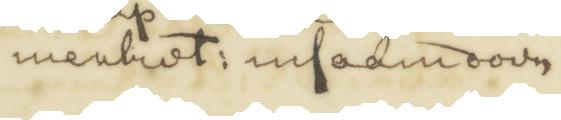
merkel: insaam doen
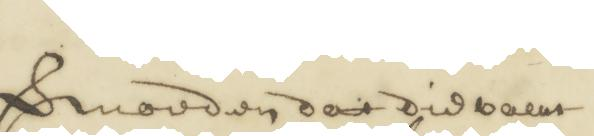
vermoeden dat die vaert
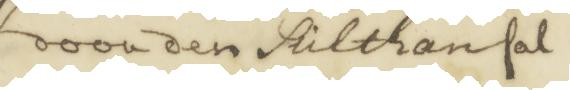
door den sulthan sal
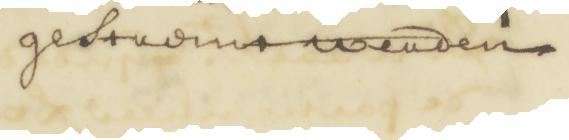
gestremt werden
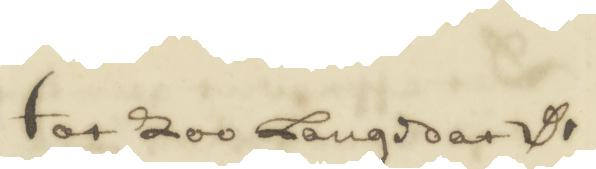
tot zoo lange dat De
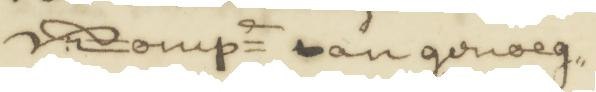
E: Comp=e van genoeg„
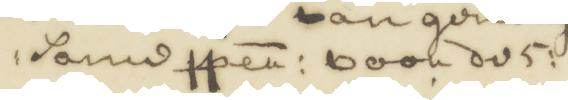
„same pper: voor de 5:
